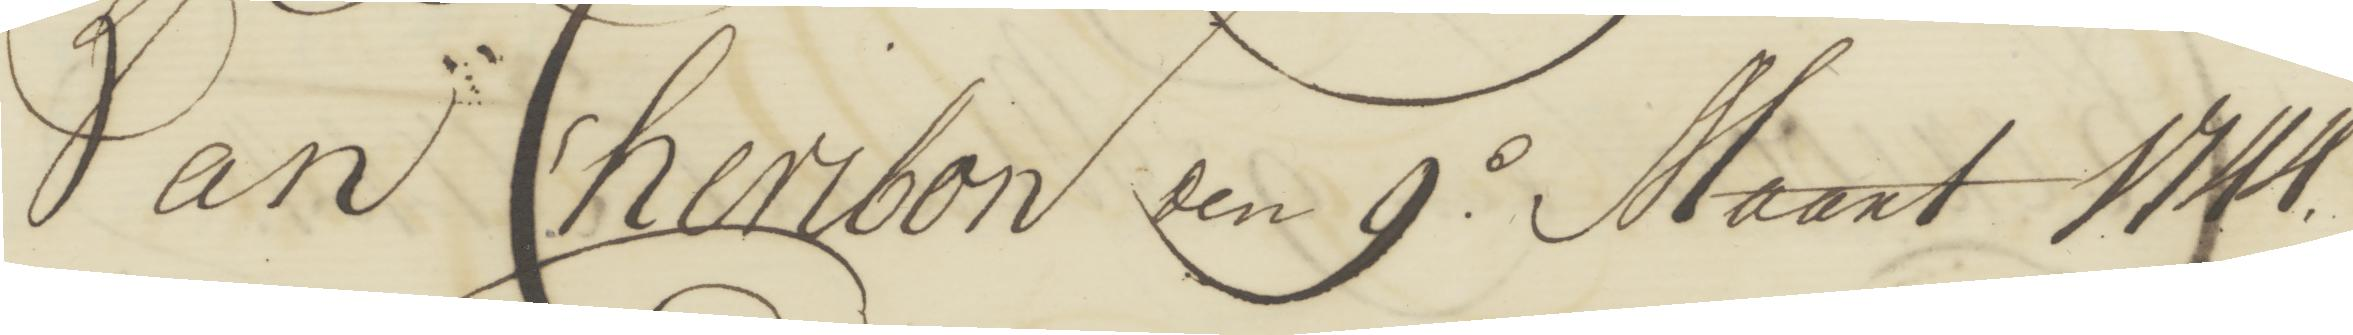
Van Cheribon den 9.e Maart 1744.
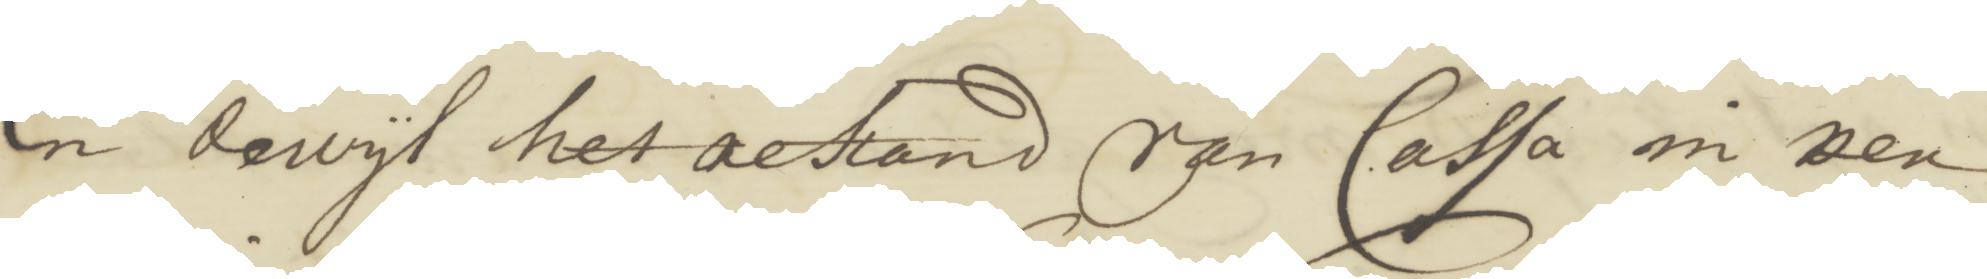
En dewijl het restand van Cassa in ver
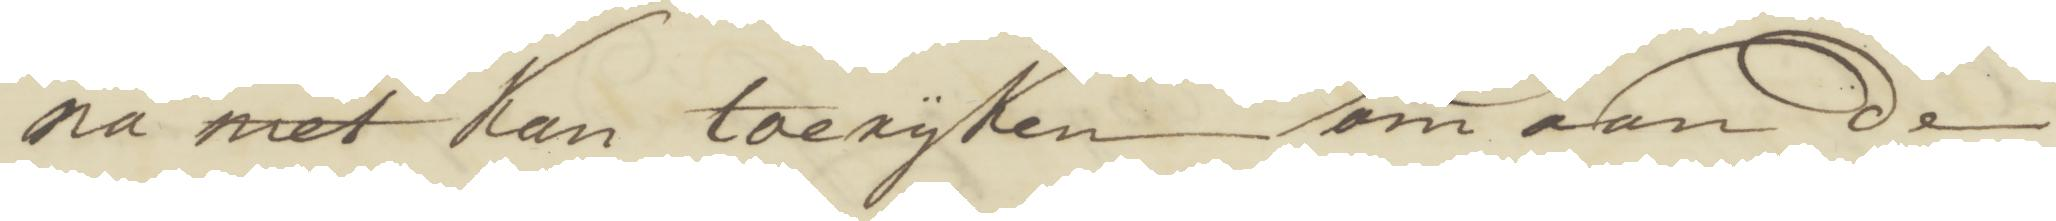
na niet kan toerijken om aan de
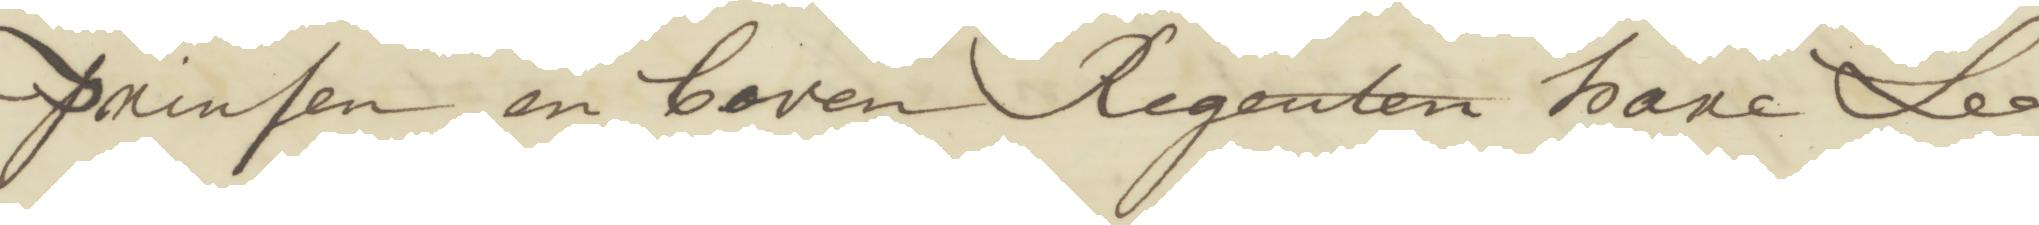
Prinsen en boven Regenten hare Lee
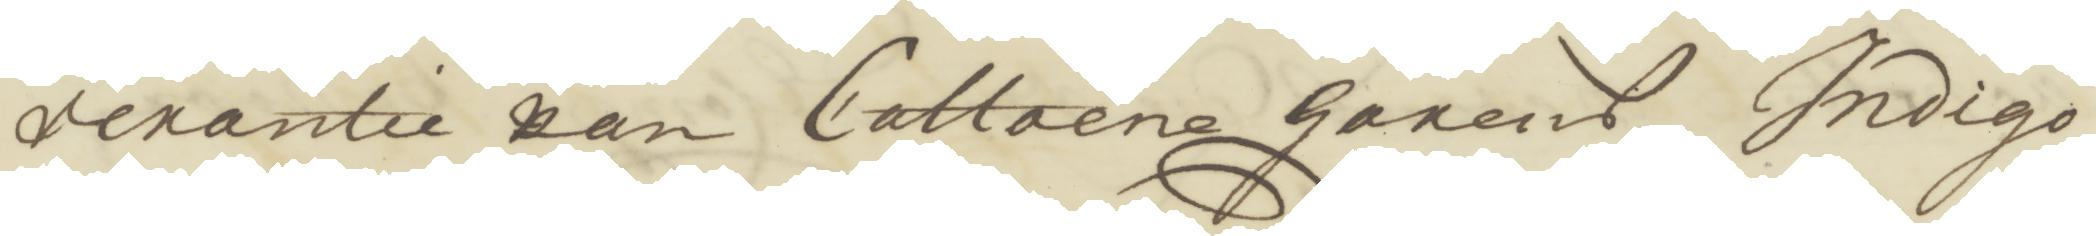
verantie van Cattoene garens, Jndigo
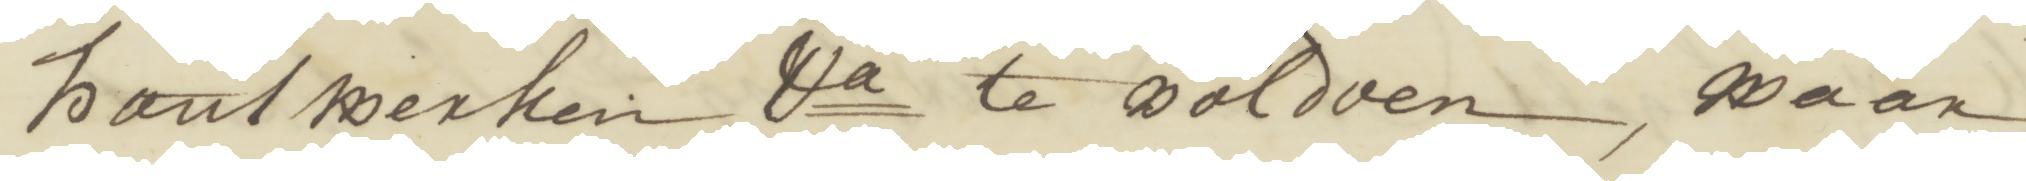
houtwerken Et=a te voldoen, waar
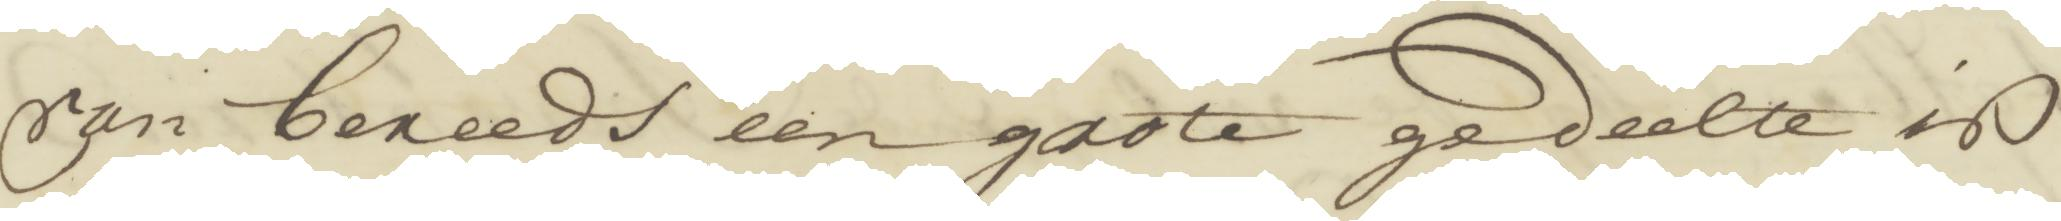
van bereeds een grote gedeelte is
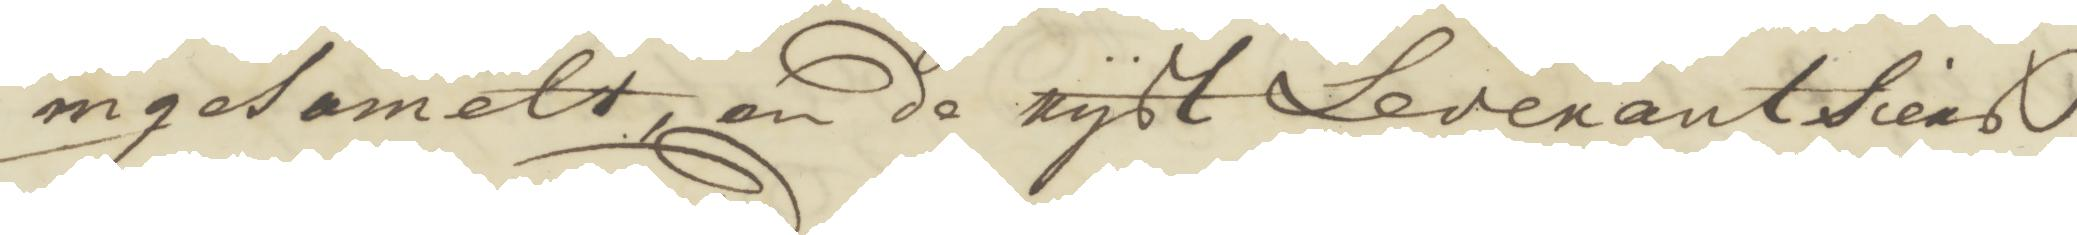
ingesamelt, en de rijst Leverantsiers
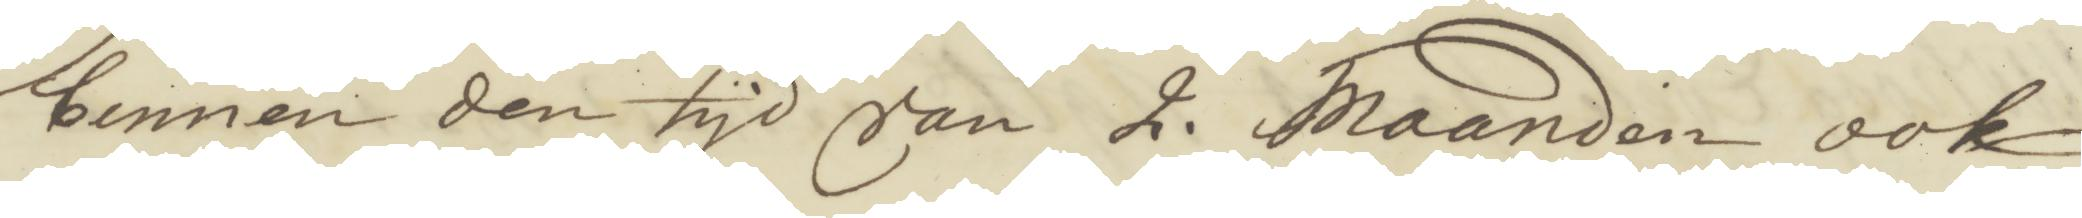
binnen den tijd van 2. Maanden ook
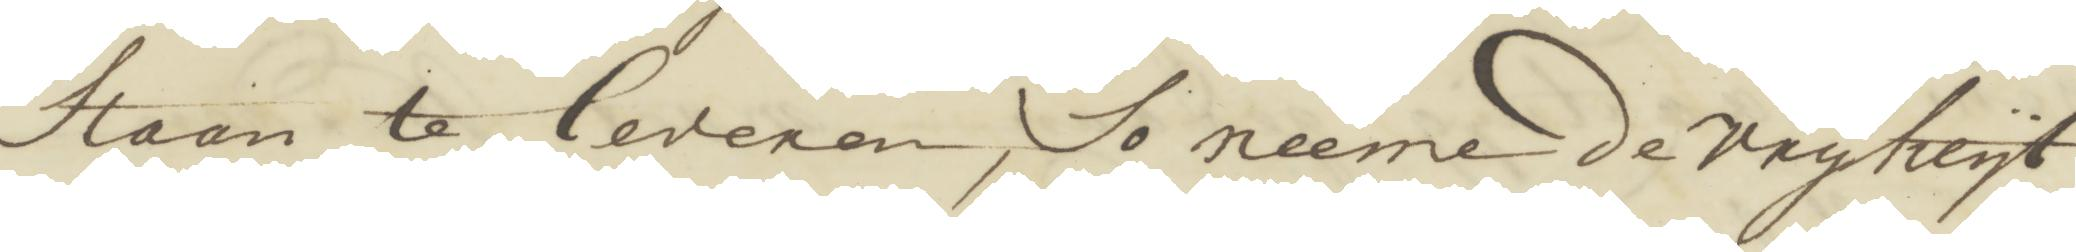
staan te leveren, so neeme de vrijheijt
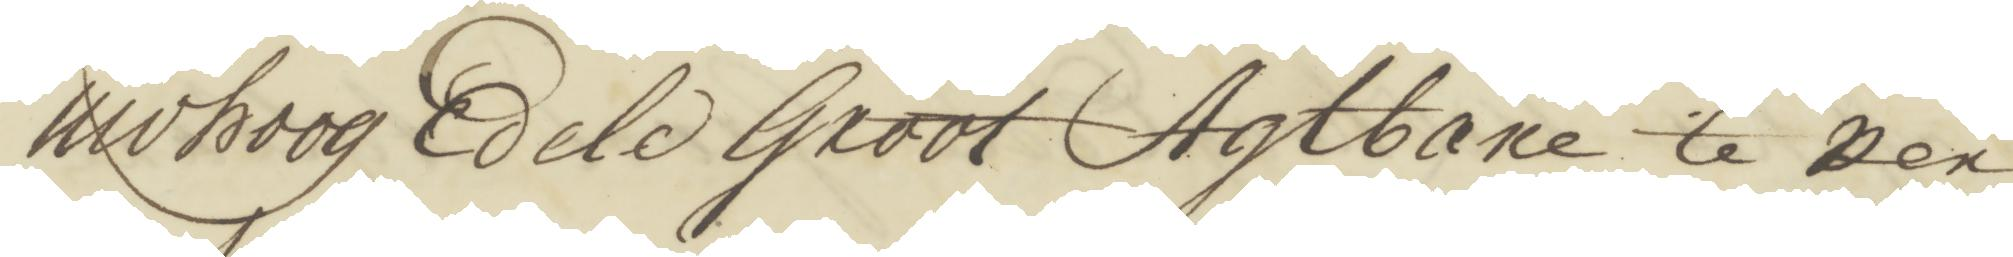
uw hoog Edele Groot Agtbare te ver
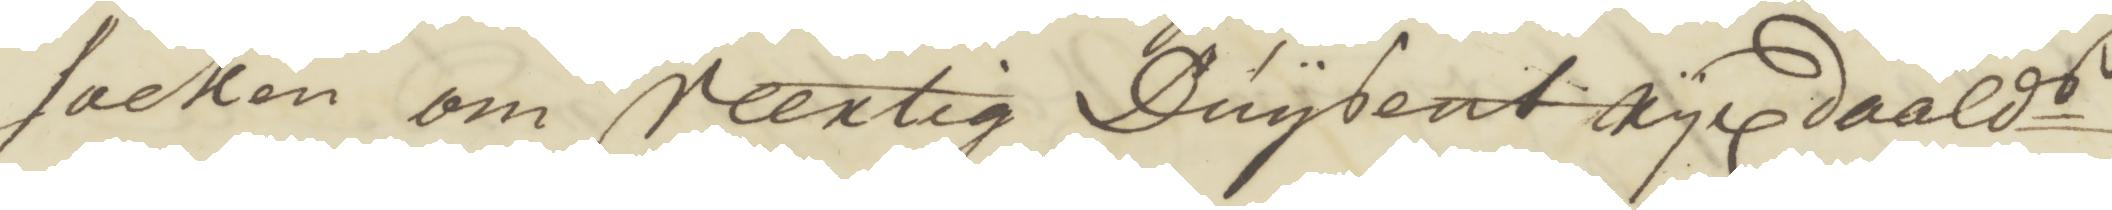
soeken om veertig Duijsent rijx daald=s
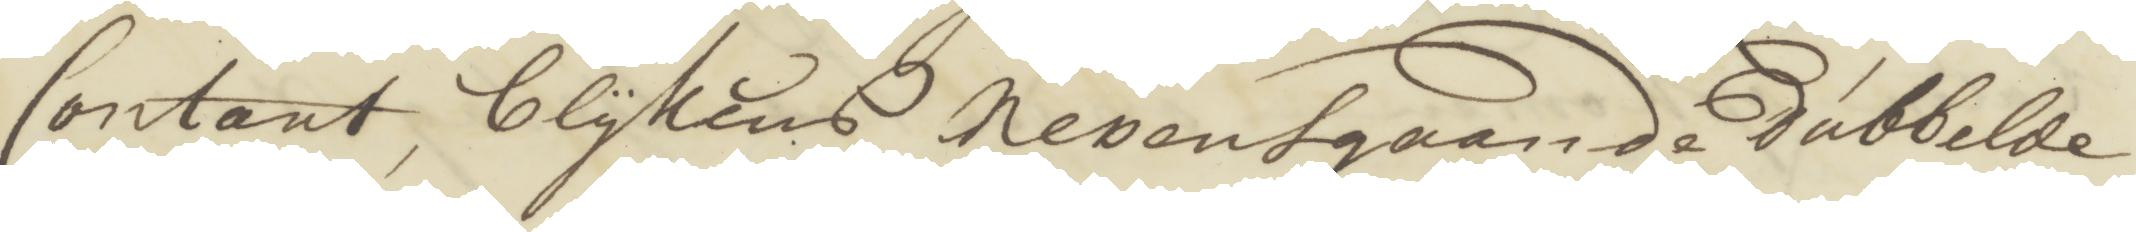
Contant, blijkens nevensgaande dubbelde
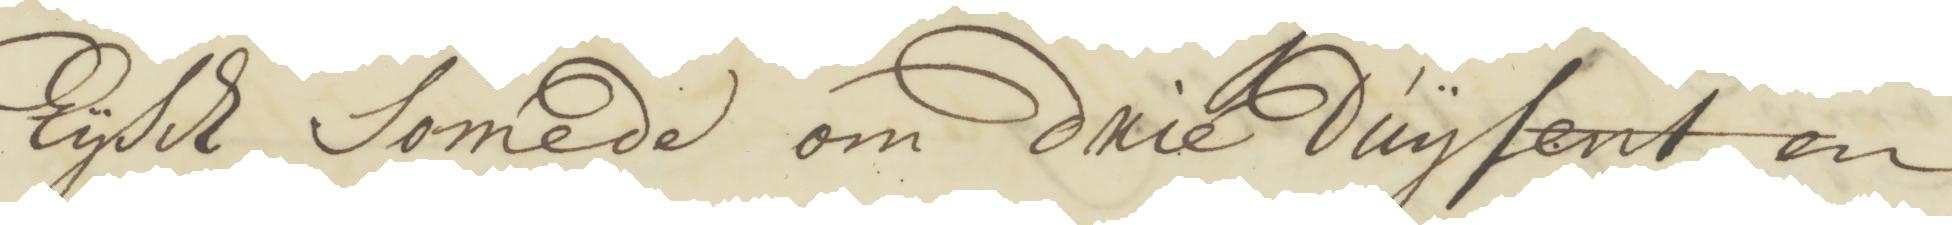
Eijsch, somede om drie duijsent, en
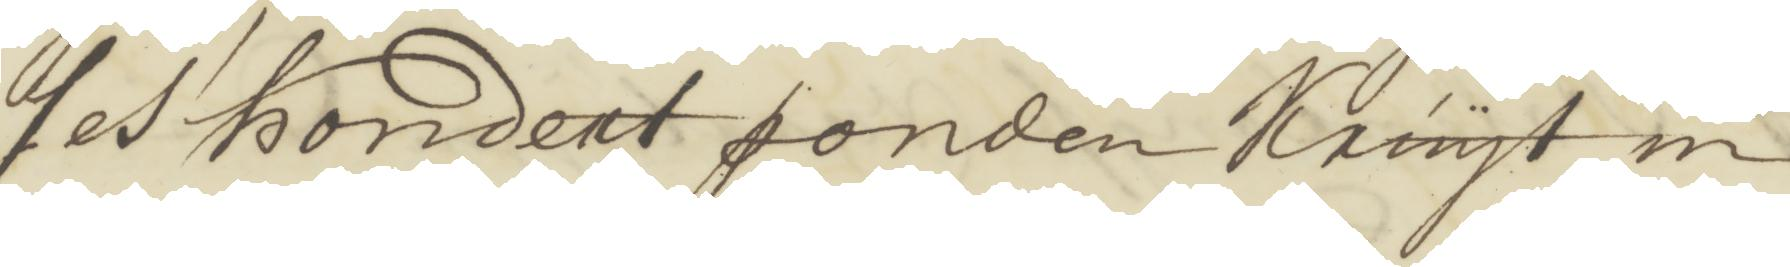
ses hondert ponden Kruijt in
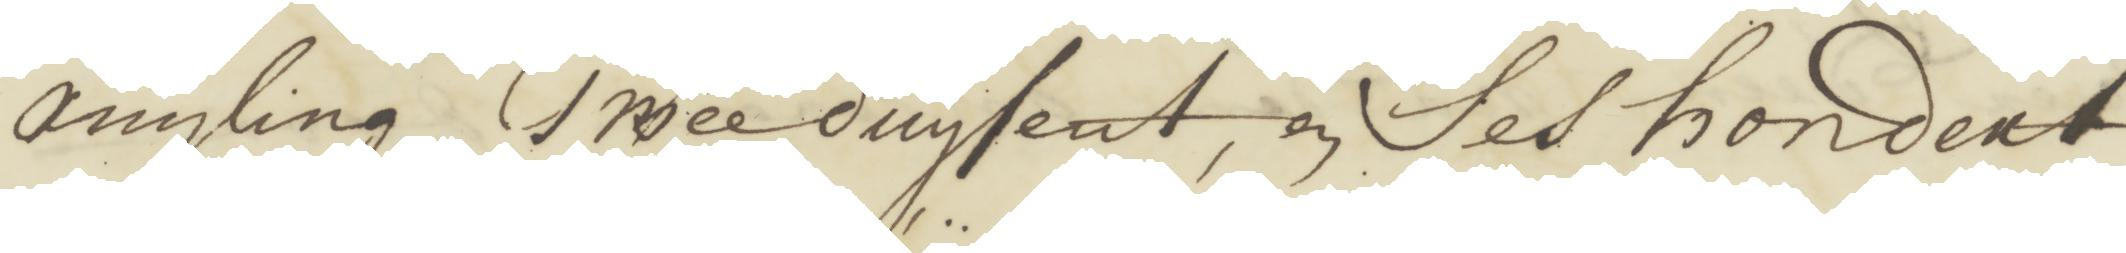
ruijling, Twee duijsent, en ses hondert
